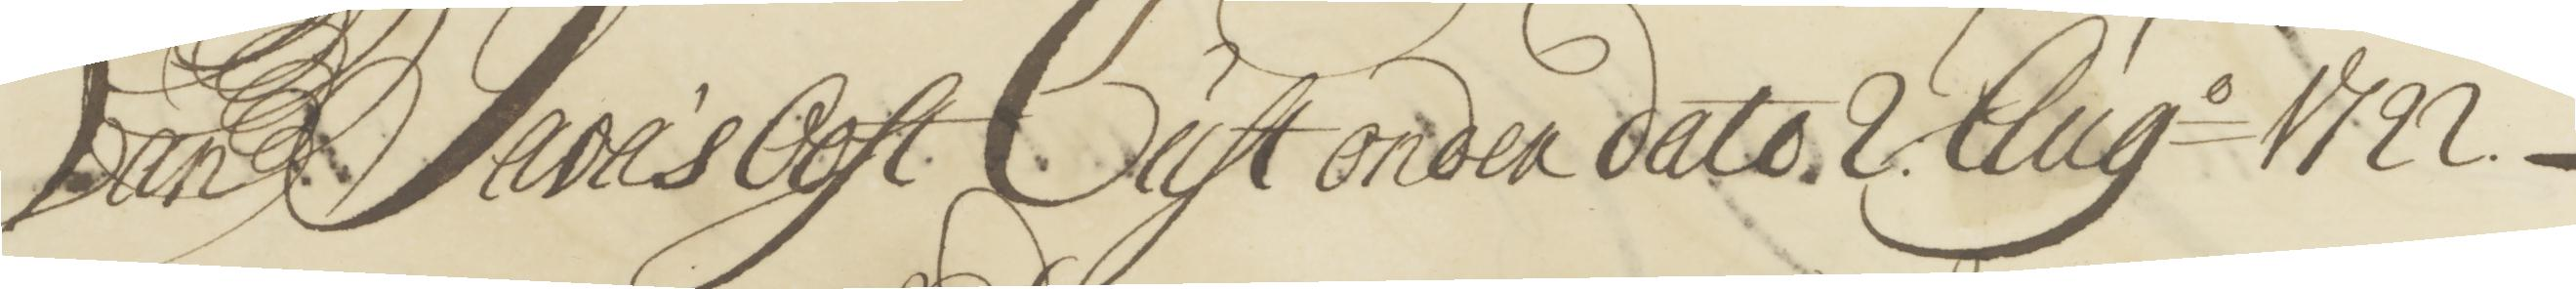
Van Java's Oost Cust onder dato 2:' Aug=o 1722. —
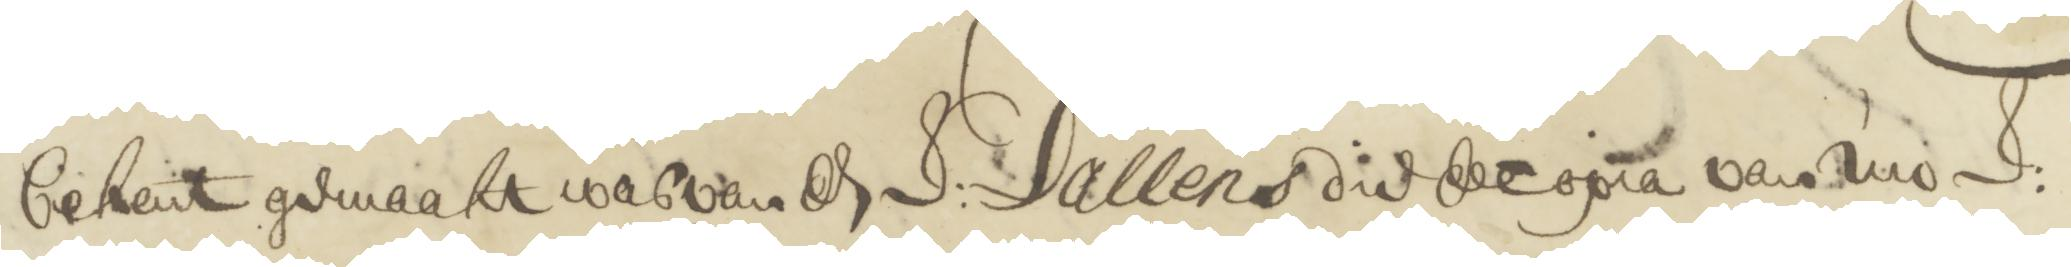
bekent gemaakt was van den E: Dallens die de copia van uw E:
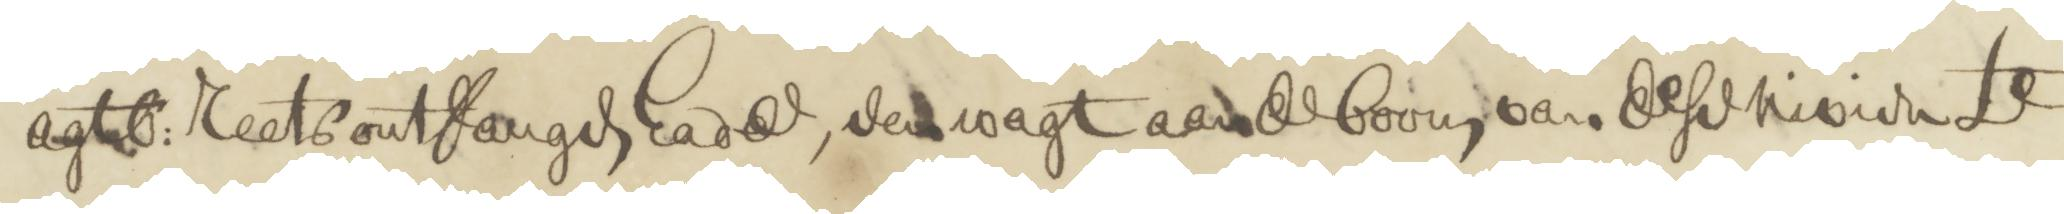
agtb: Reets ontfangen hadde, een wagt aan de boom van dese rivier te
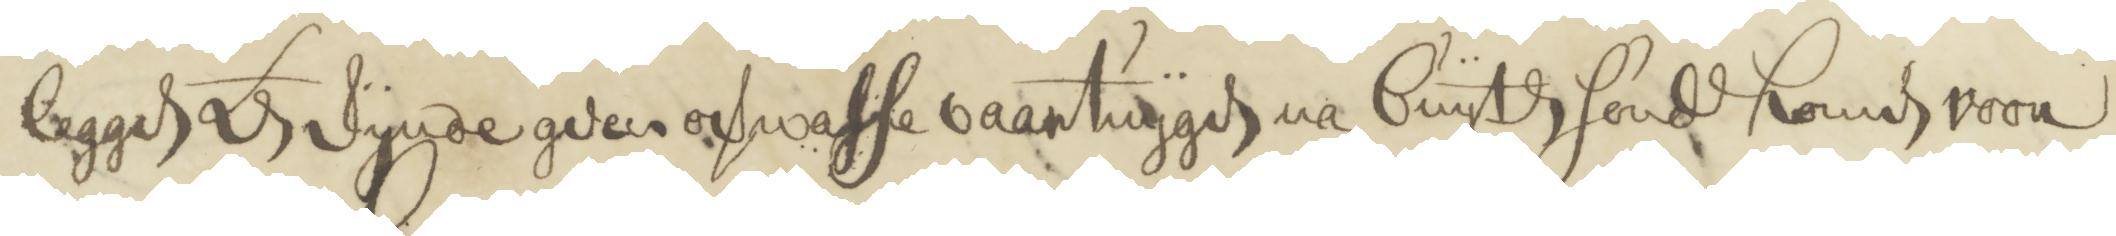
leggen Ten Eijnde geen overwasse vaartuijgen na buijten Soude komen voor
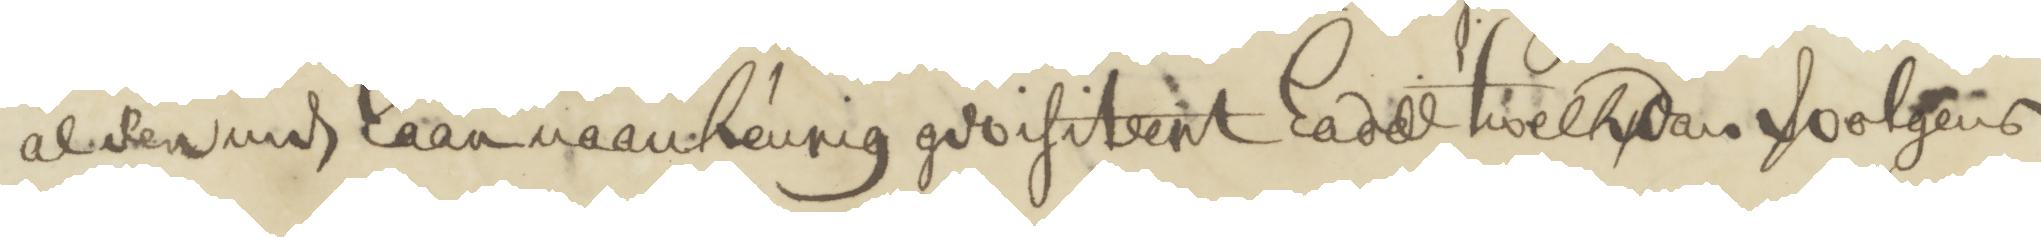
al eer men haar naaukeurig gevisiteert hadde 'twelk, dan vervolgens
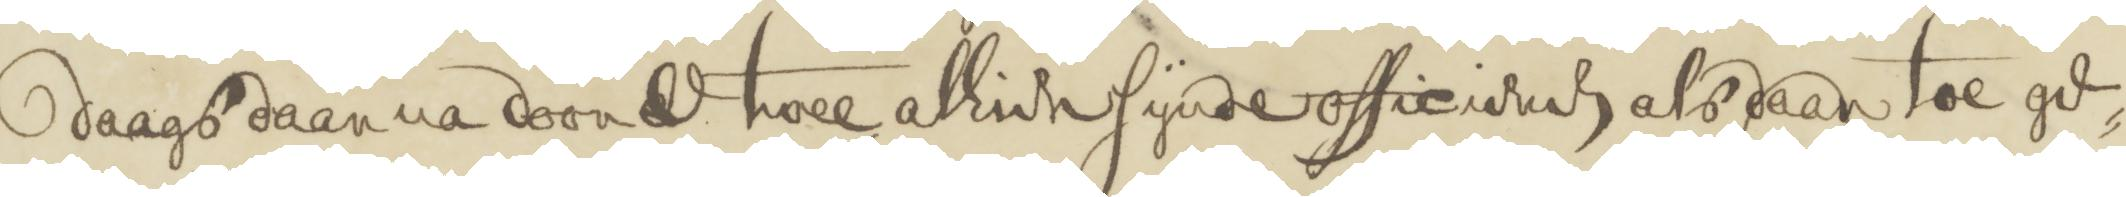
daags daar na door de twee alhier Sijnde officieren als daar toe ge„
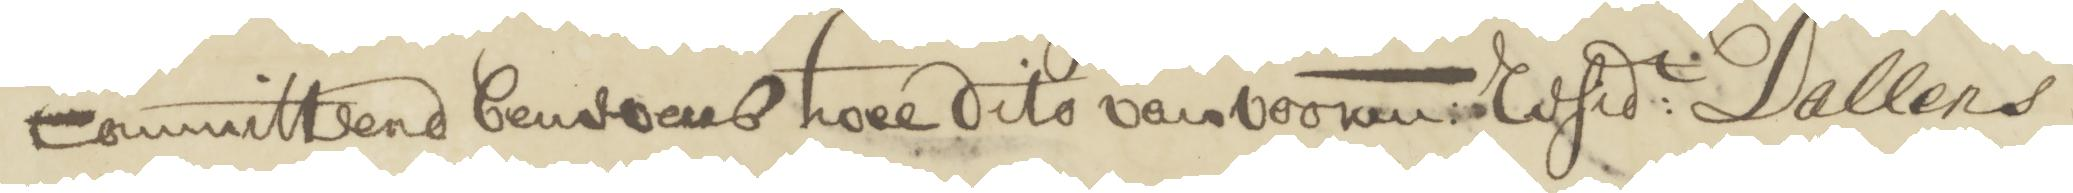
committeerd benevens twee dito van voorm: Resid:t Dallens
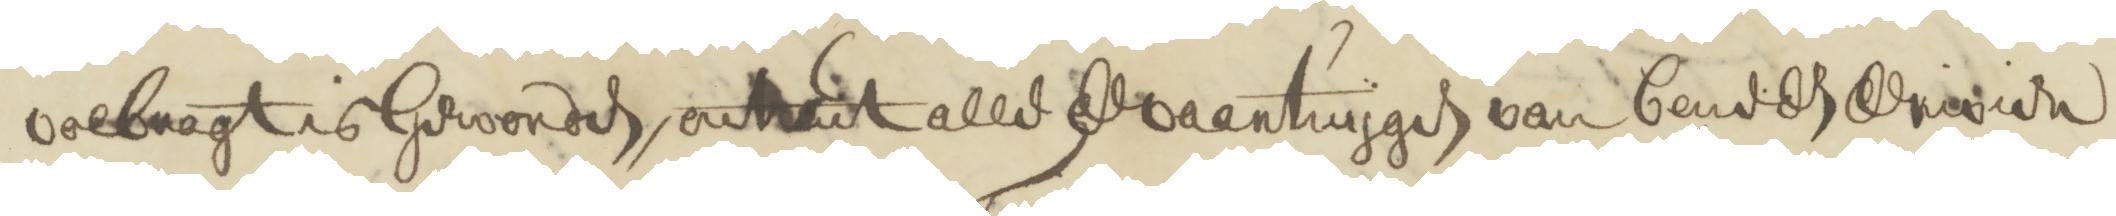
volbragt is Geworden, ontrent alle de vaartuijgen van beneden de rivier
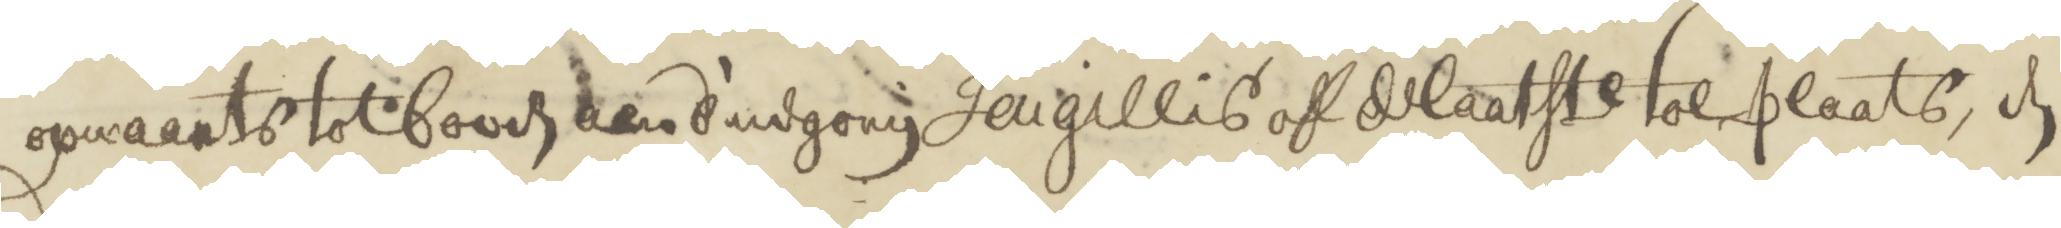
opwaarts tot boven aan d' negorij Tagillis of de laatste tolplaats, en
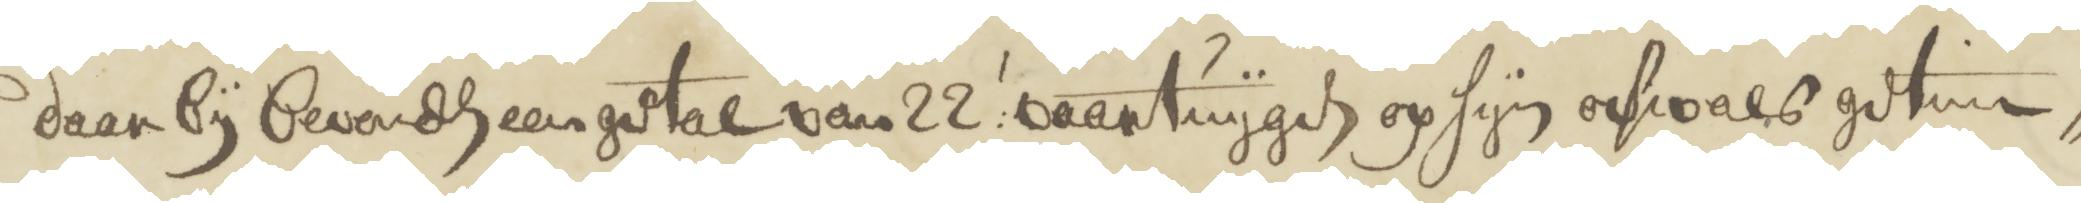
daar bij bevonden een getal van 22: vaartuijgen op sijn overwals getim
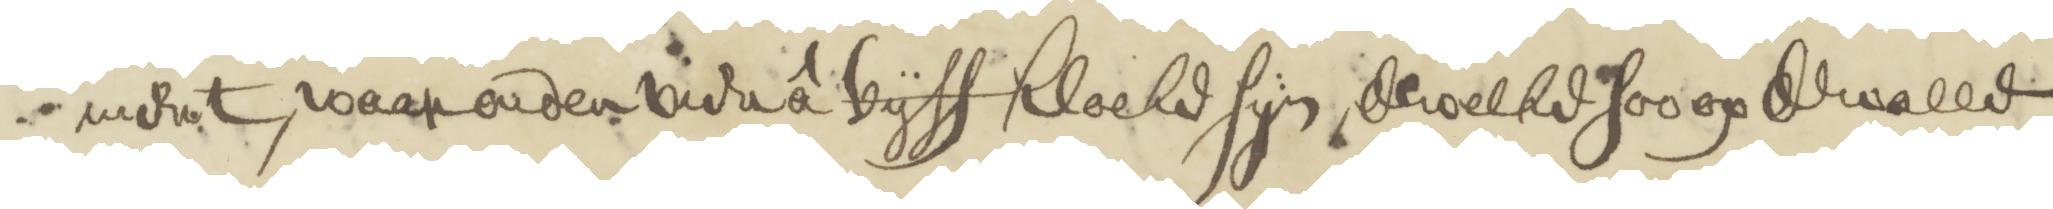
-mert, waaronder vier â vijff kloeke Sijn, dewelke Soo op de walle
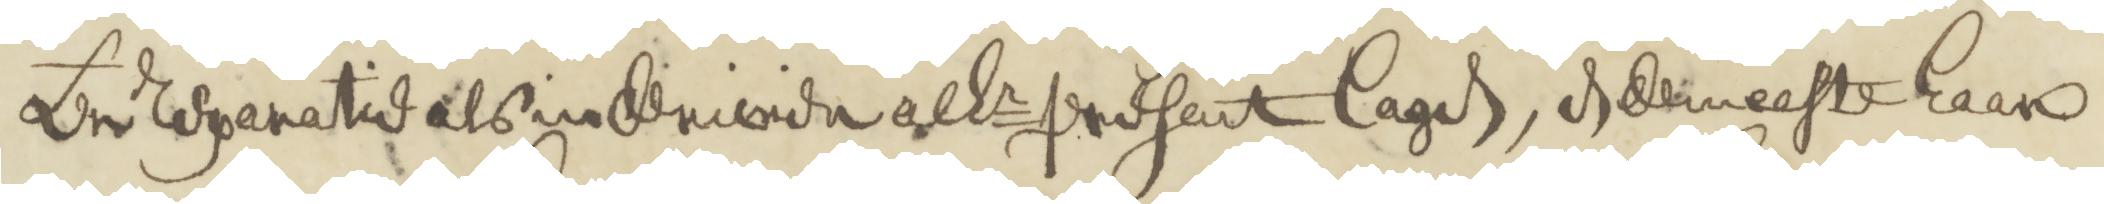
Ter Reparatie als in de rivier alh=r present lagen, en de meeste haar
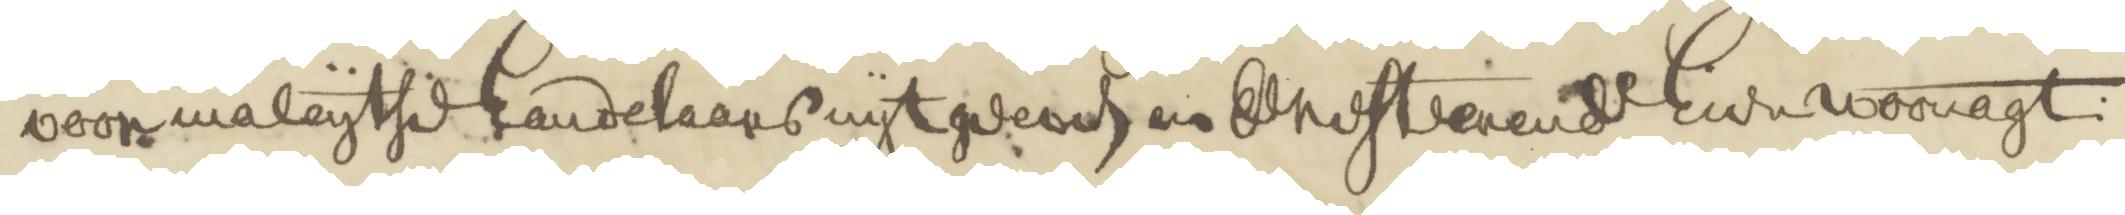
voor maleijtse handelaars uijt geeven en de resteerende hier woonagt:
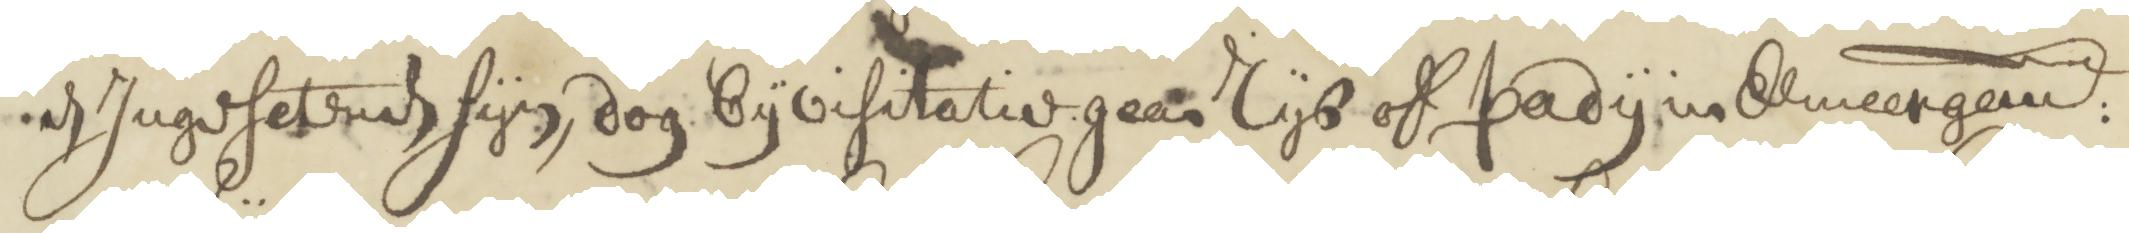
en Jngesetenen Sijn, dog bij visitatie geen Rijs of padij in de meer gem:
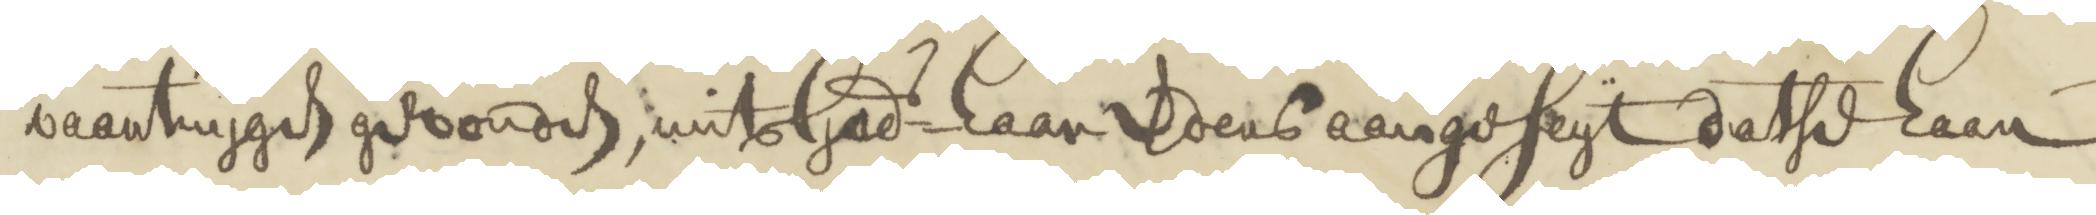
vaartuijgen gevonden, mitsgad=s haar verders aangeseijt dat se haar
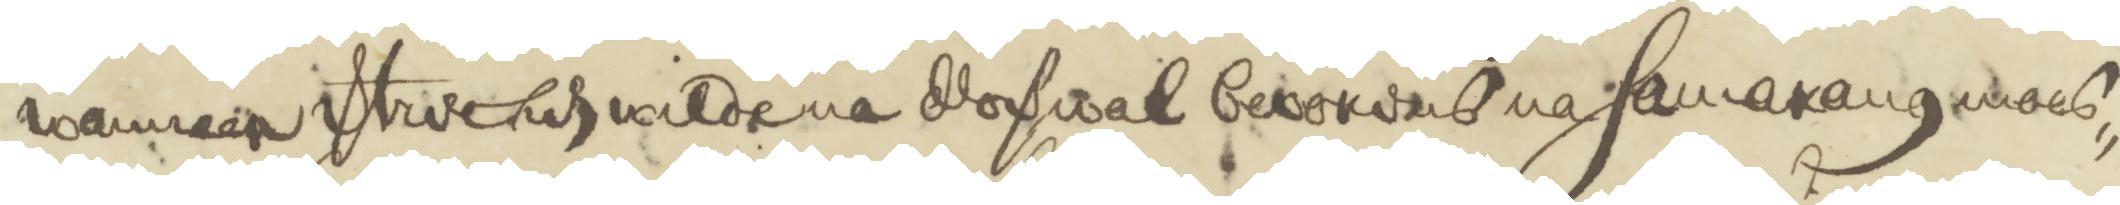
wanneer vertrecken wilde na de overwal bevorens na Samarang moes„
